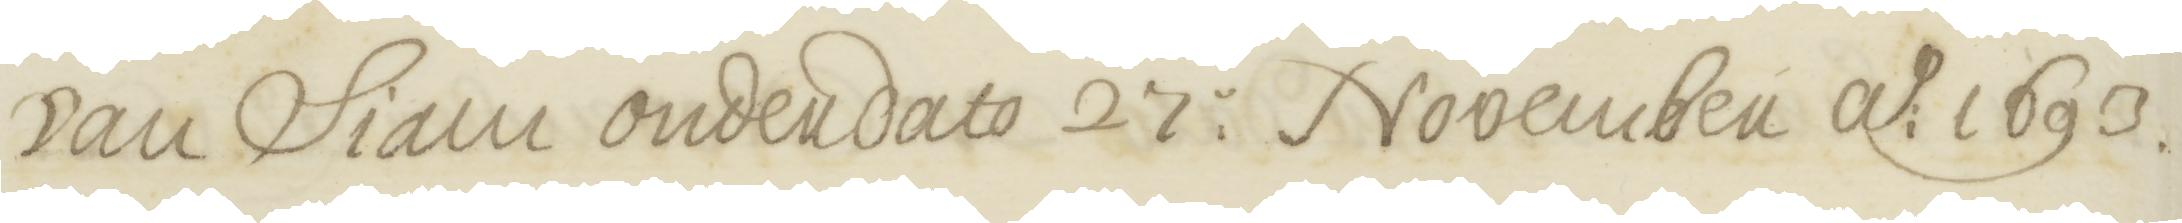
van Siam onder dato 27:' November a:o 1693.
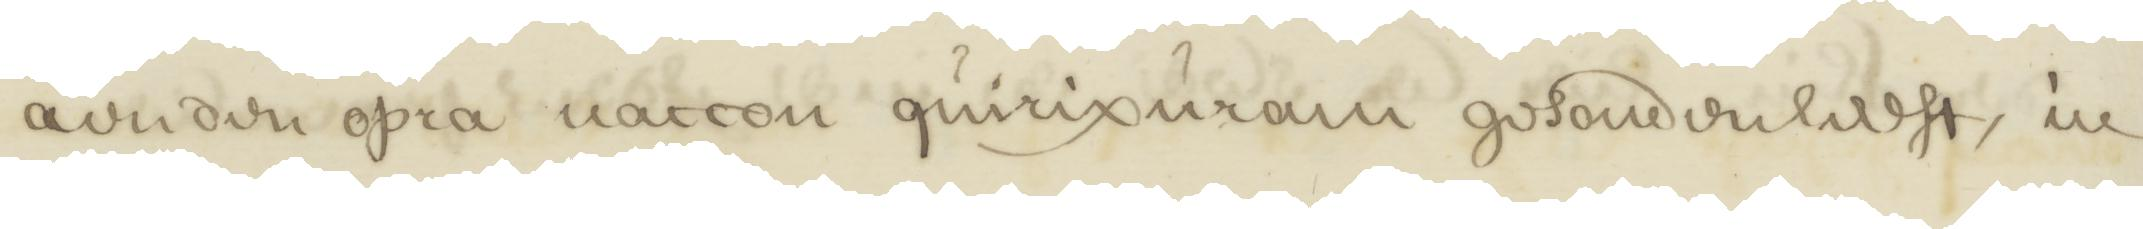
aen den opra naccon quiripuram gesonden heeft, in
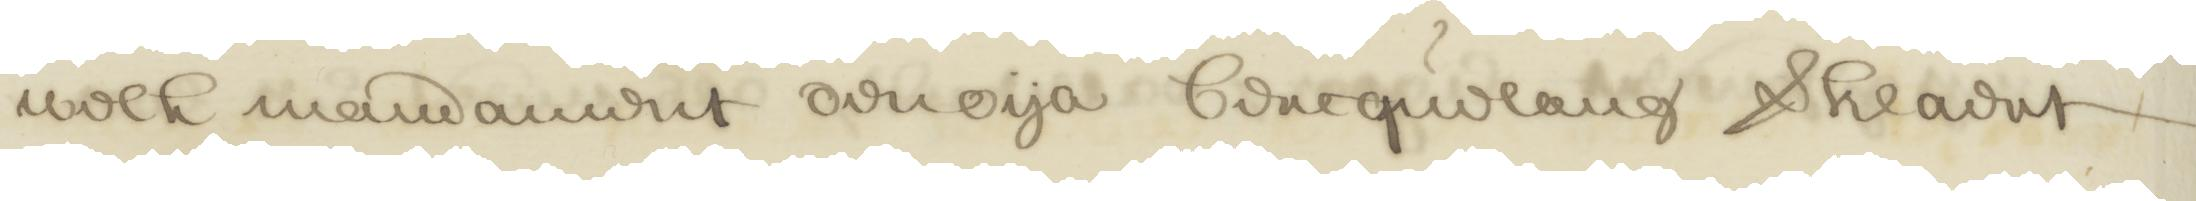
welk mandament den oija bercquelang verklaert
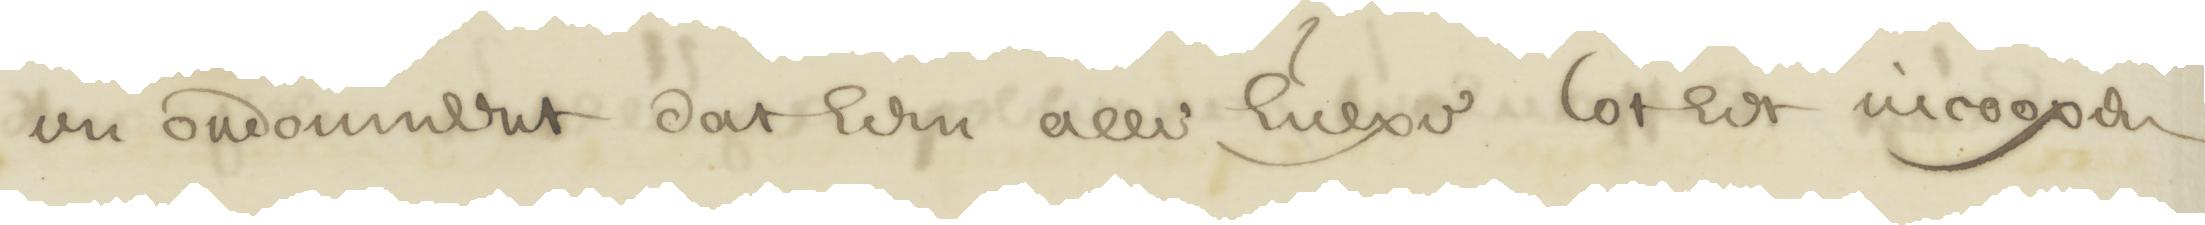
en ordonneert dat hem alle hulpe tot het incoopen
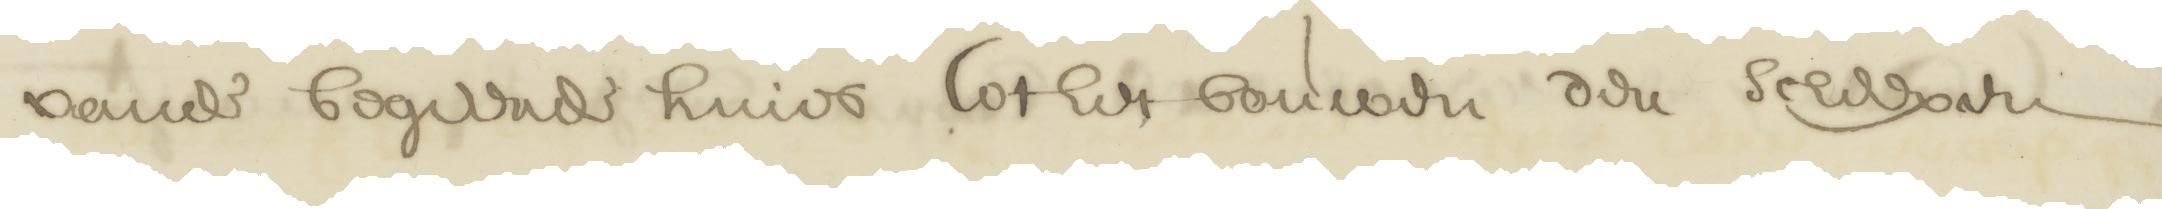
vande begeerde knies tot het bouwen den scheepen
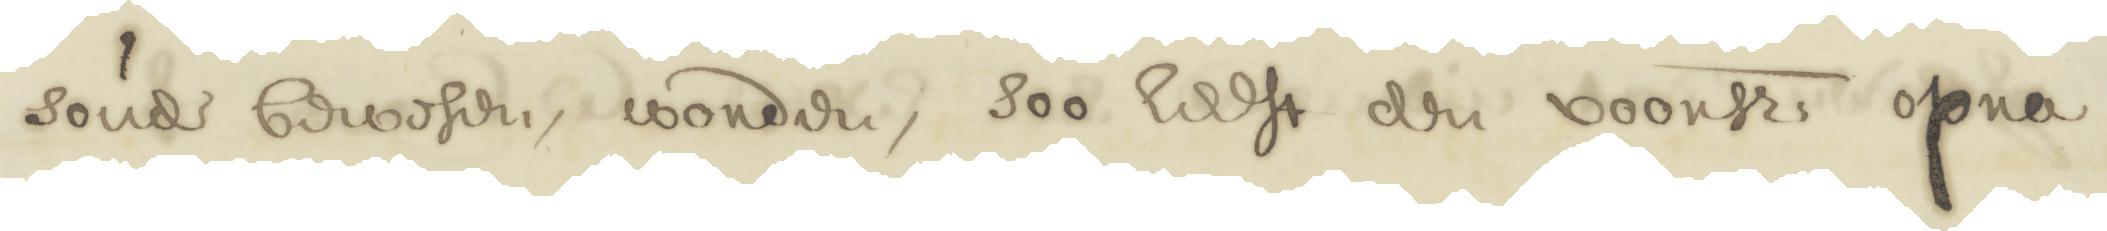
soude bewesen, worden, soo heeft den voorsz: opna
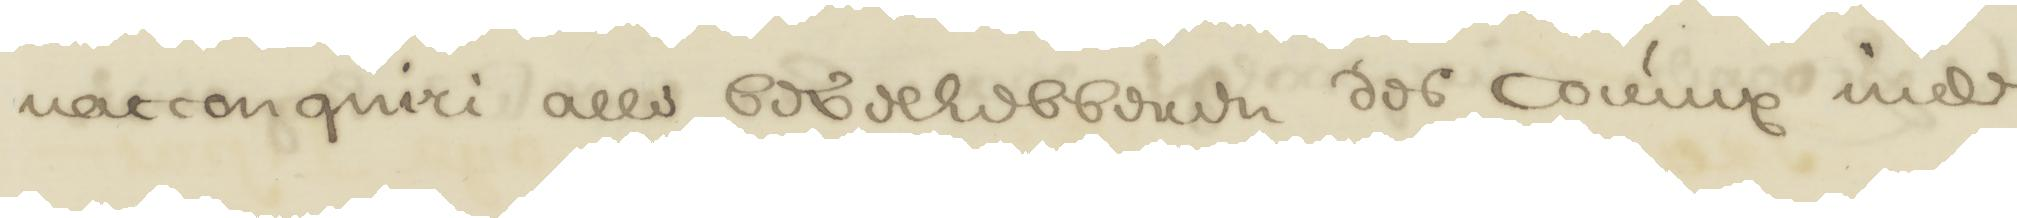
nacconquiri alle bevelhebberen des coninx inde
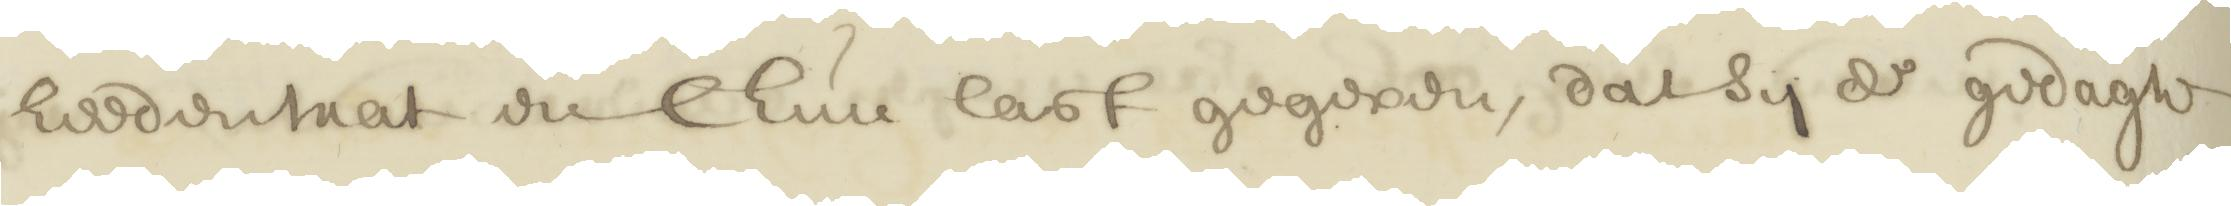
heedentrat en Chun last gegeven, dat sij de gedagte
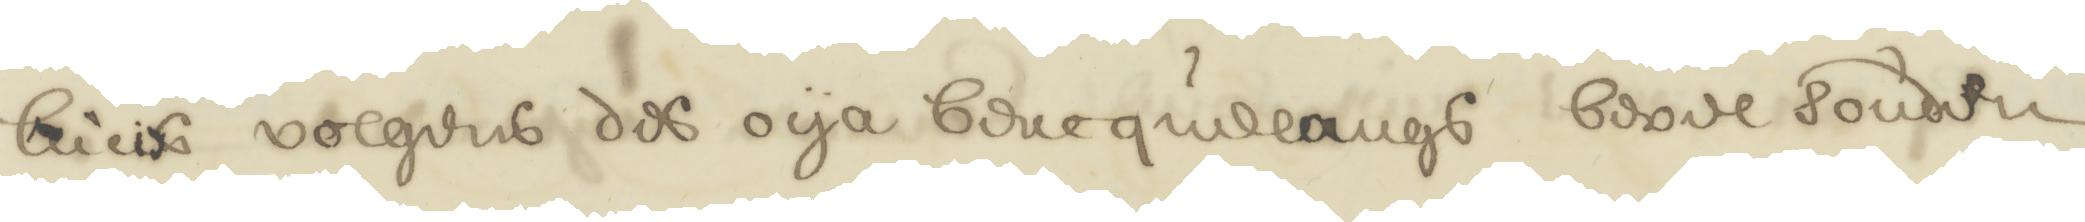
bieis volgens des oija bercquelangs bevel souden
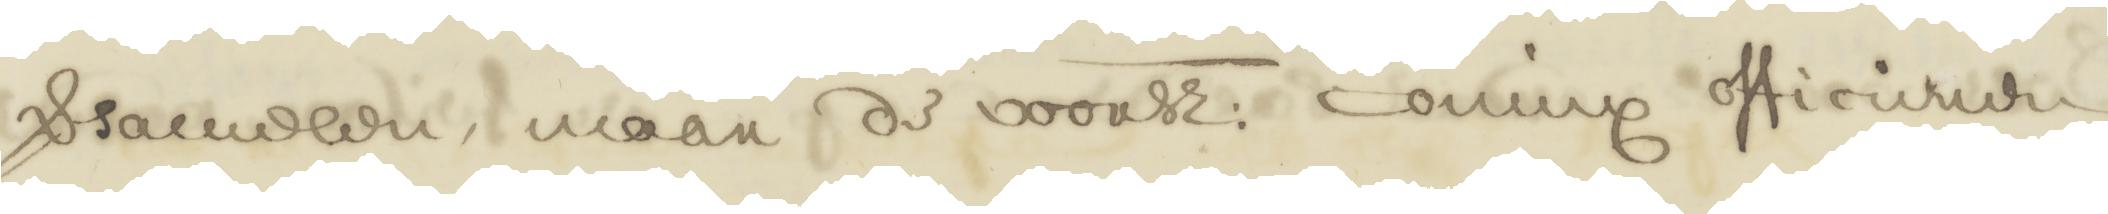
versamelen, maar de voorsz: coninx officieren
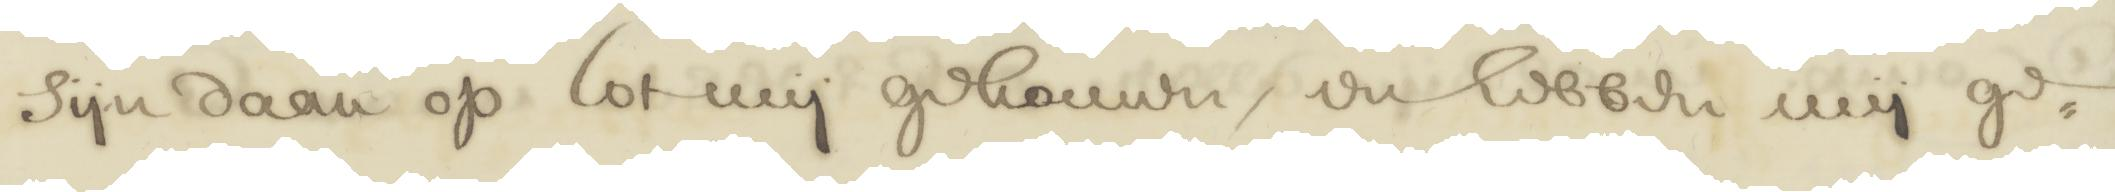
sijn daar op tot mij gekomen, en hebben mij ge„
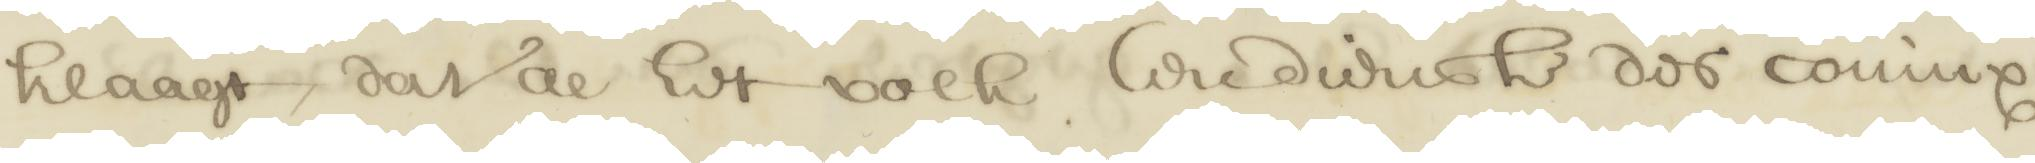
klaagt, dat de het volk ten dienste des coninx
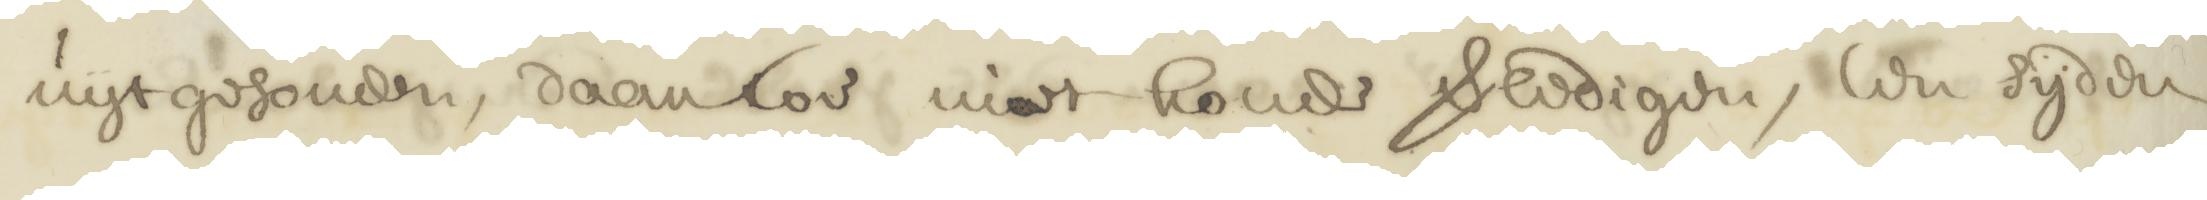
uijt gesonden, daar toe niet konde verledigen, ten sijden
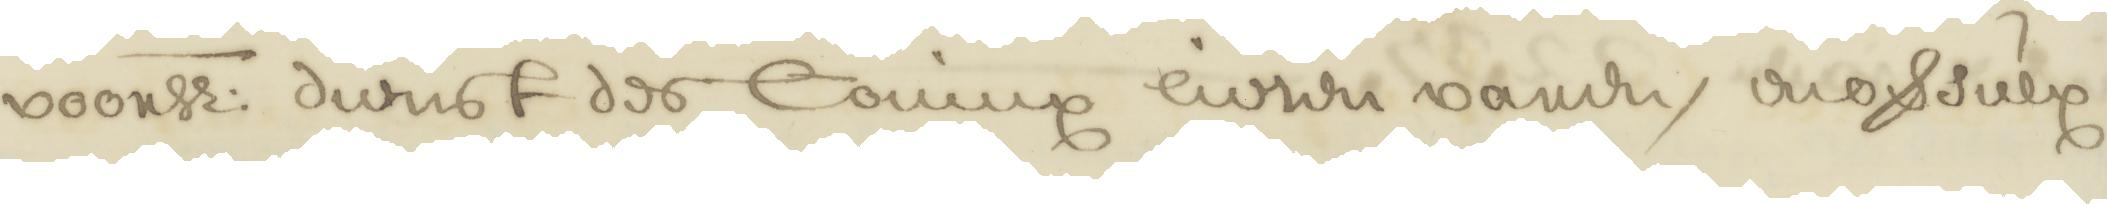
voorsz: dienst des Coninx lieten varen, en oversulx
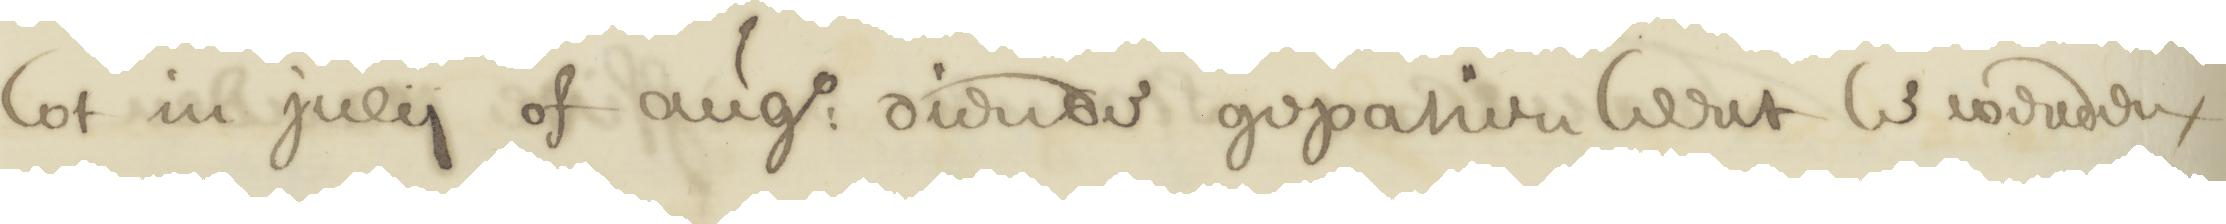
tot in julij of aug:o diende gepatienteert te werden,
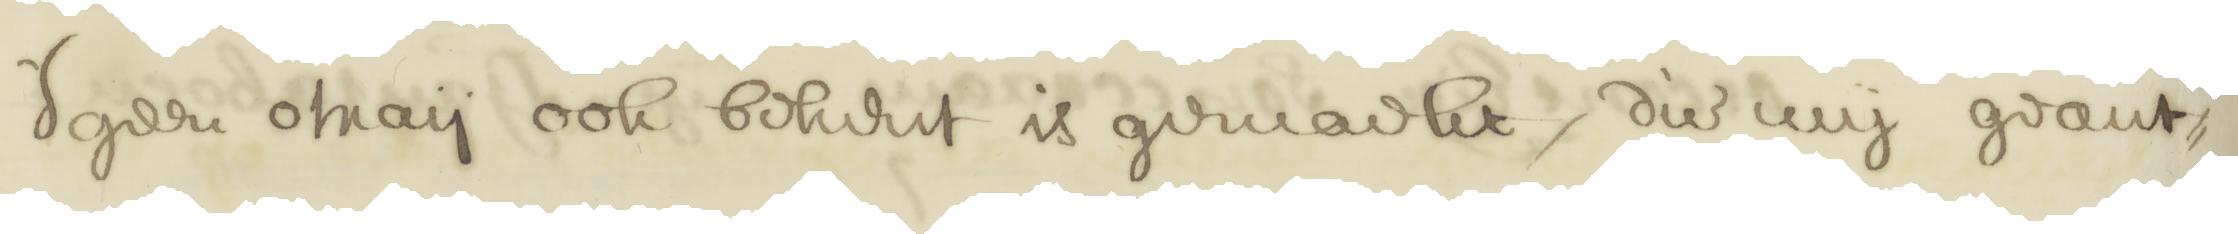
't geen otraij ook bekent is gemaekt, die wij geant„
